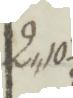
2„10
